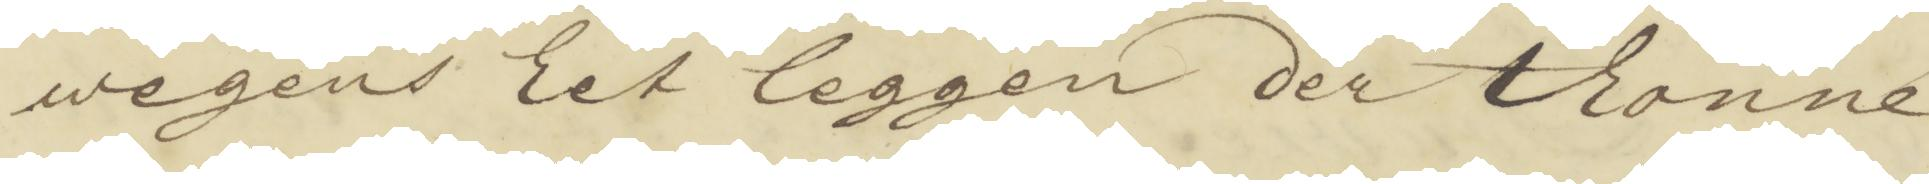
wegens het leggen der thonne
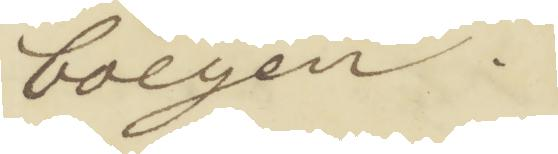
boeijen.
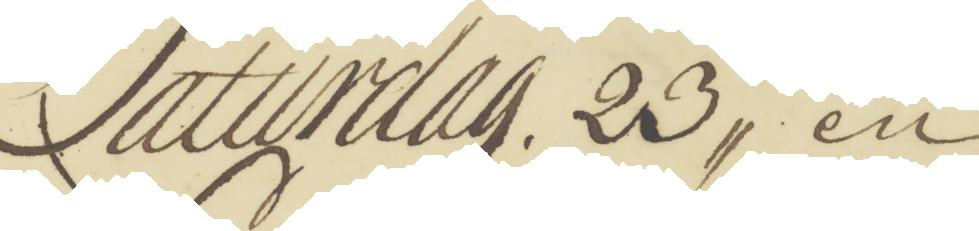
Saturdag. 23„' en
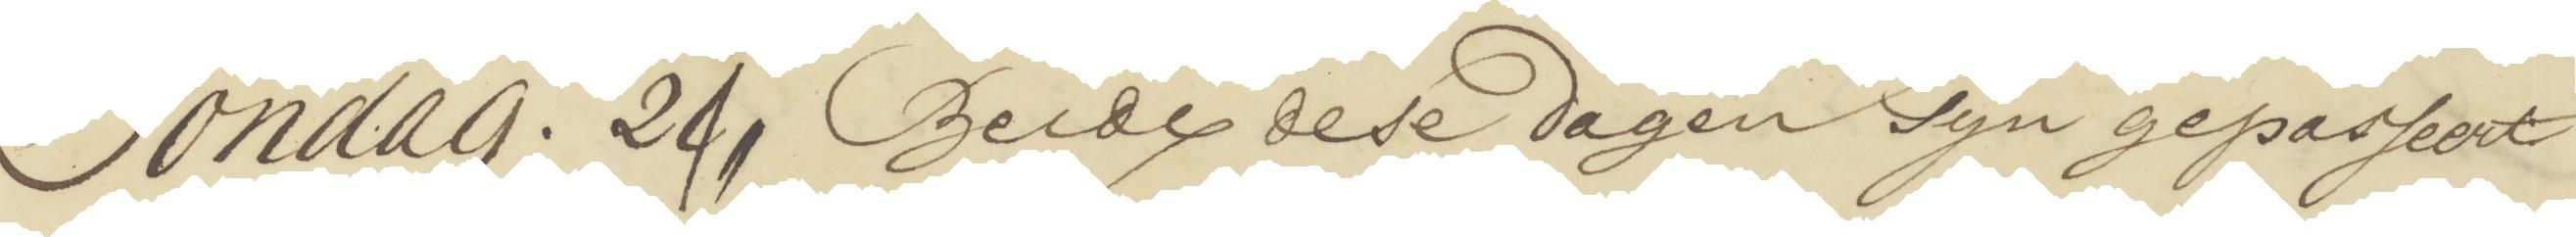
Sondag. 24„' Beide dese dagen sijn gepasseert
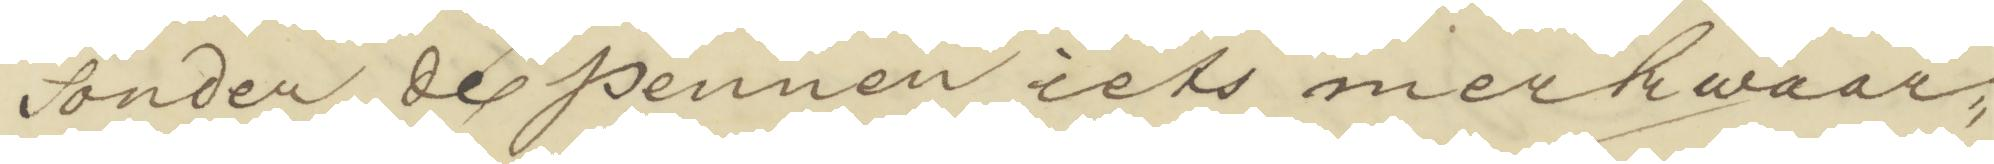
sonder de pennen iets merkwaar„
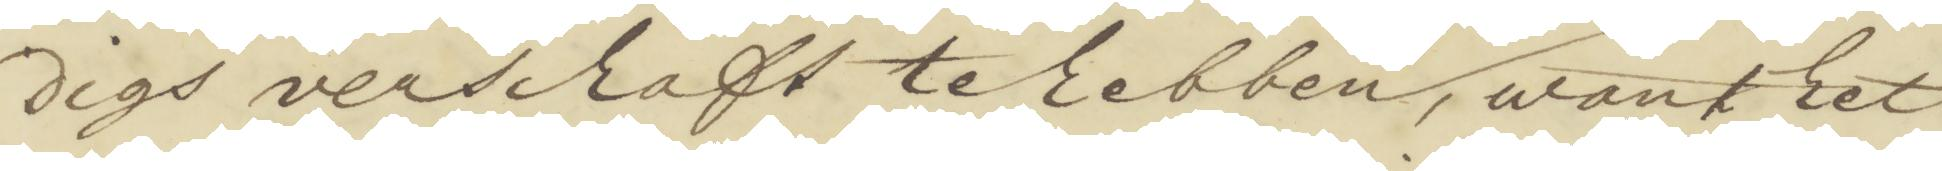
digs verschaft te hebben, want het
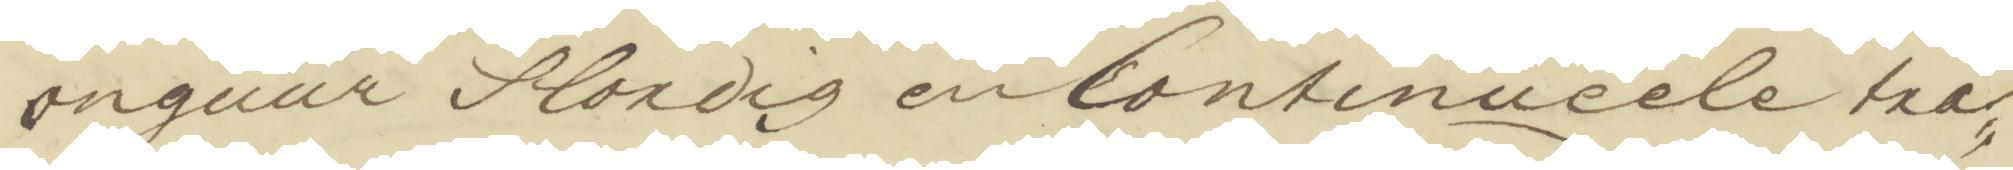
onguur slordig en Continueele tra„
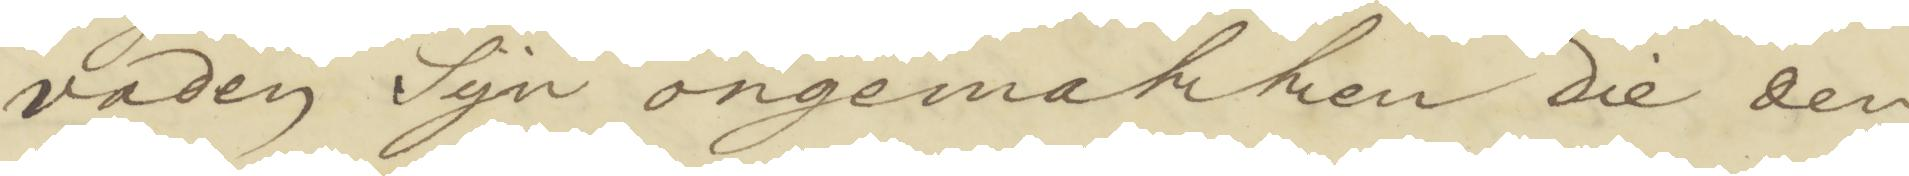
vaden sijn ongemakken die den
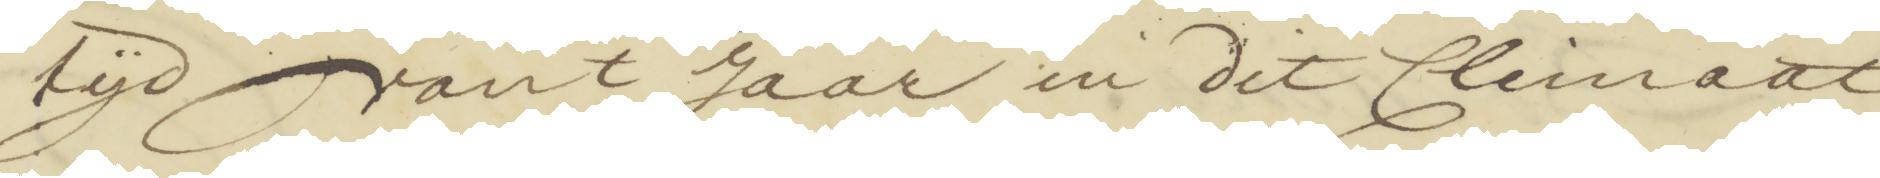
tijd van 't Jaar in dit Climaat
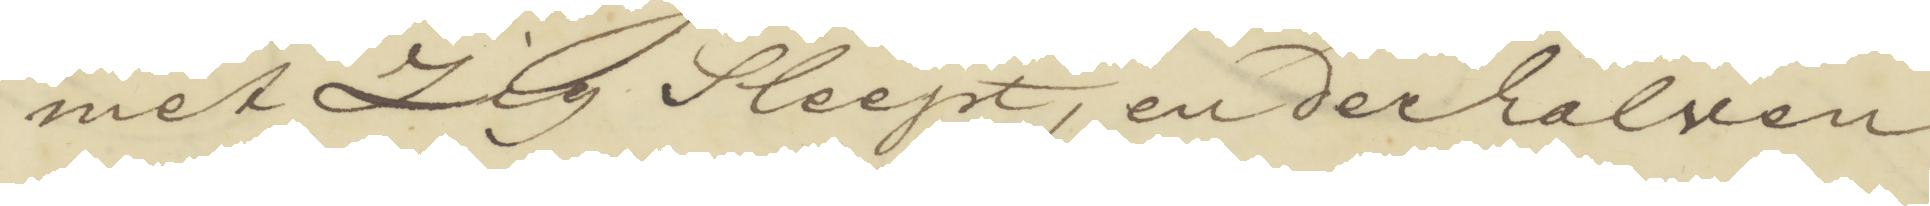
met Zig sleept, en derhalven
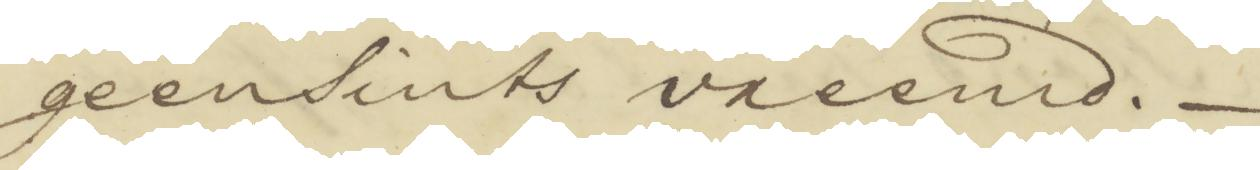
geensints vreemd._
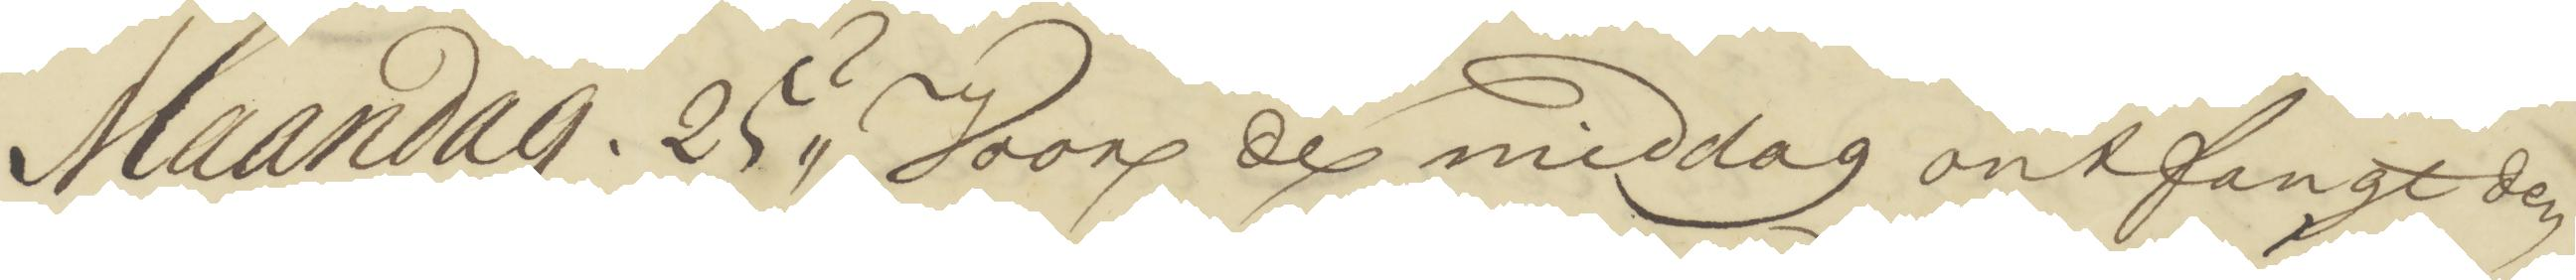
Maandag. 25„' Voor de middag ontfangt den
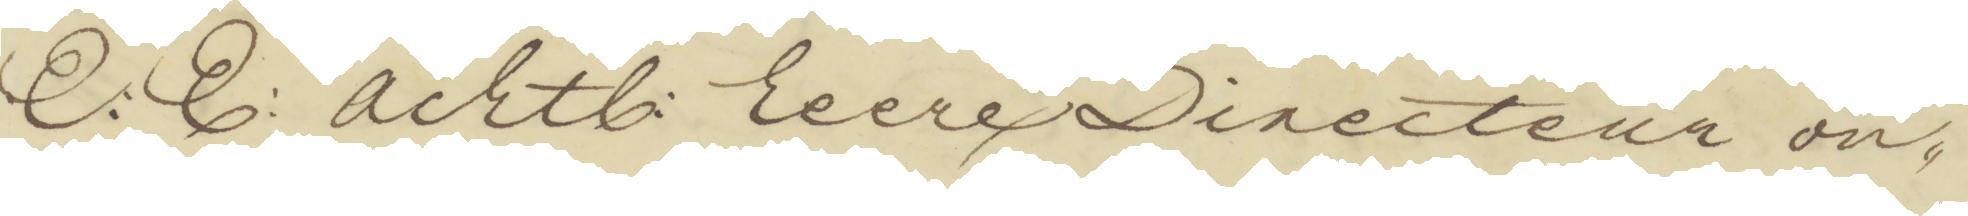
E: E: achtb: heere Directeur on„
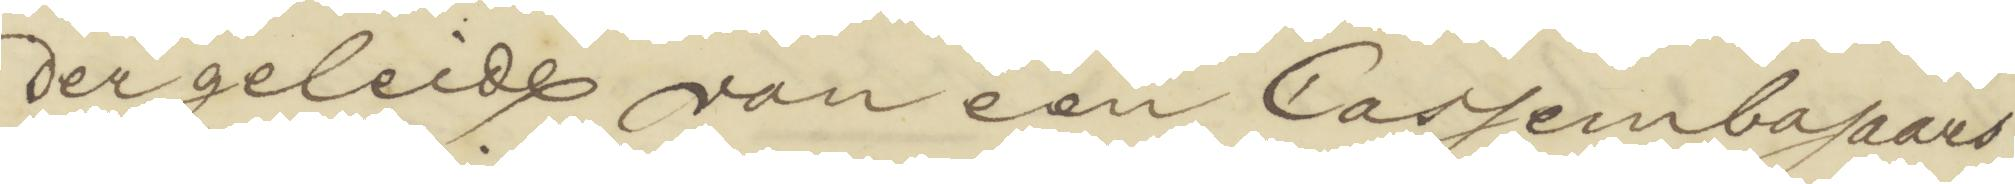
der geleide van een Cassembasaars
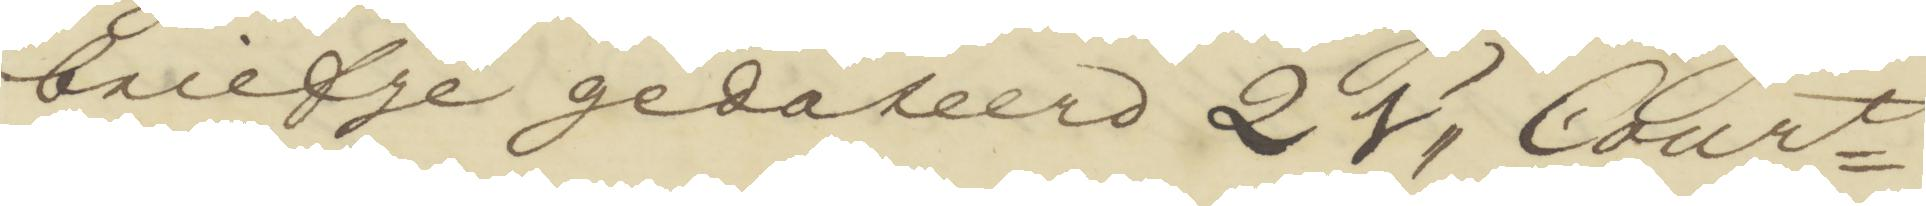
briefje gedateerd 21„' Cour=t
